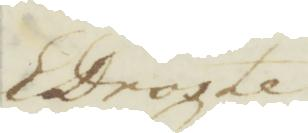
E Droste
